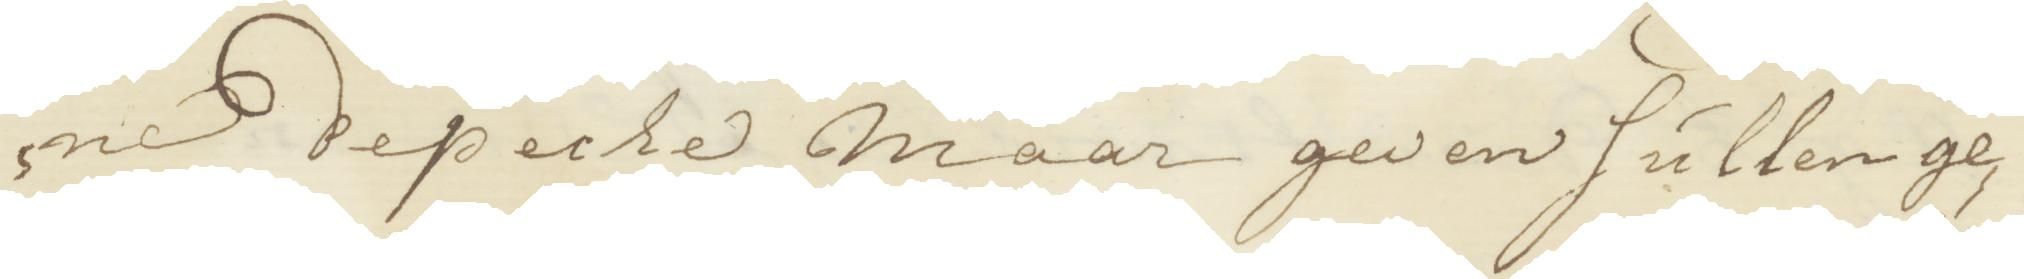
„ne depeche maar geven sullen ge„
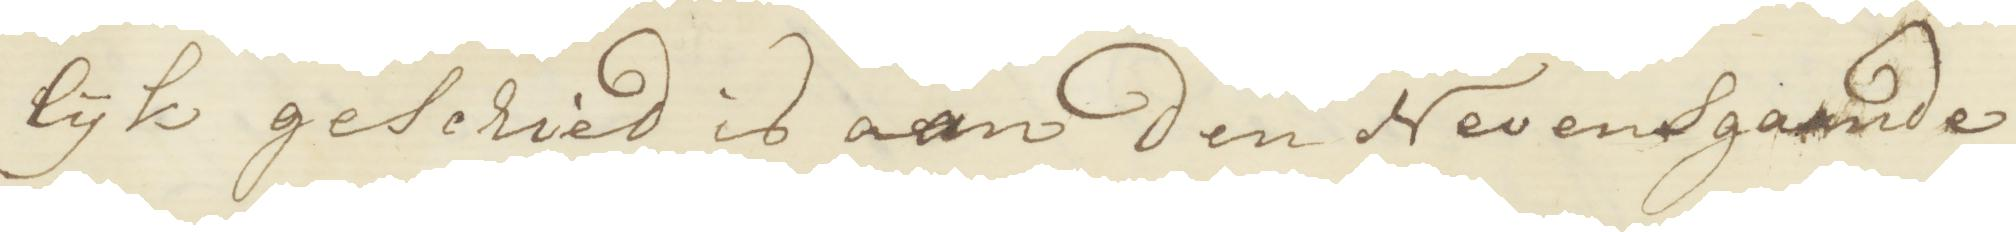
lijk geschied is aan den Nevensgaande
